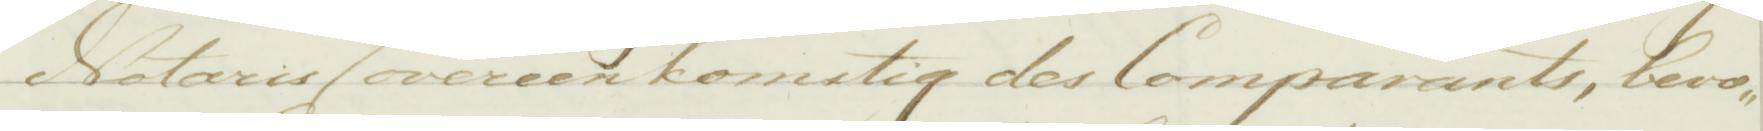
Notaris (overeenkomstig des Comparants, bevo„
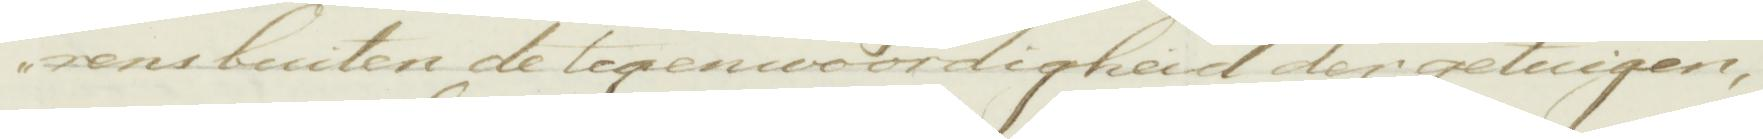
„rens buiten de tegenwoordigheid der getuigen,
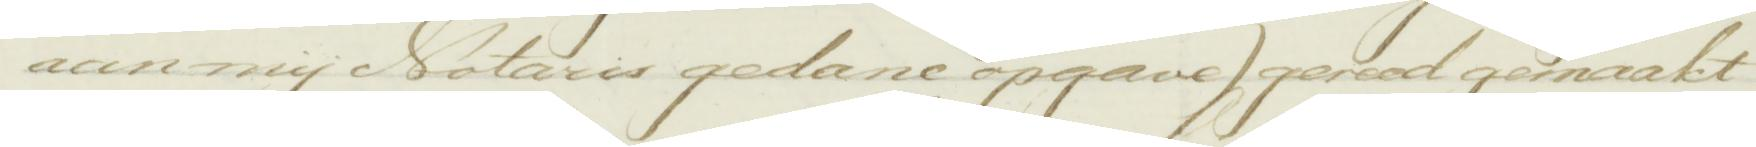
aan mij Notaris gedane opgave) gereed gemaakt
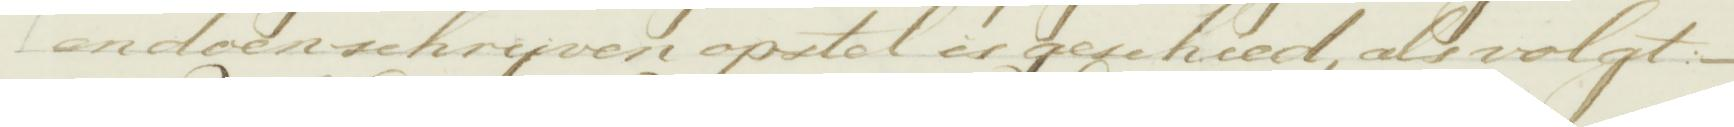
en doen schrijven opstel is geschied, als volgt:—
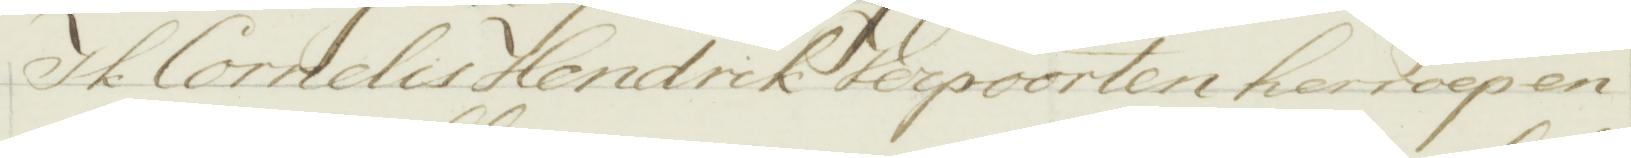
Ik Cornelis Hendrik Verpoorten herroep en
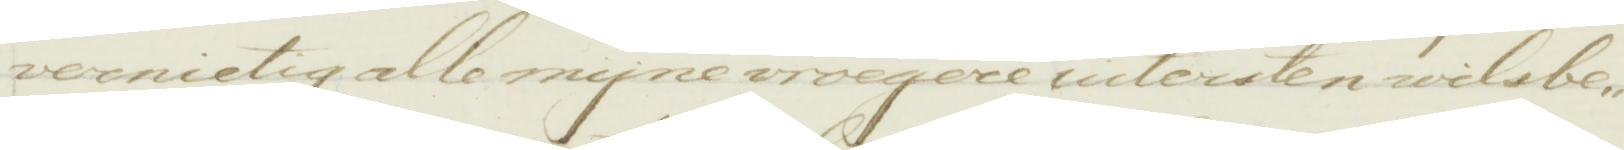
vernietig alle mijne vroegere uitersten wilsbe„
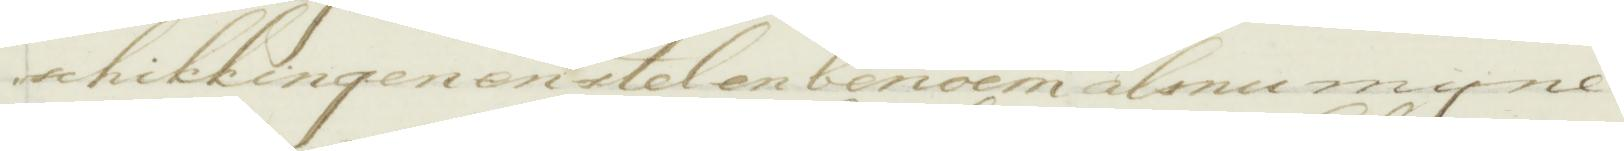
„schikkingen en stel en benoem alsnu mijne
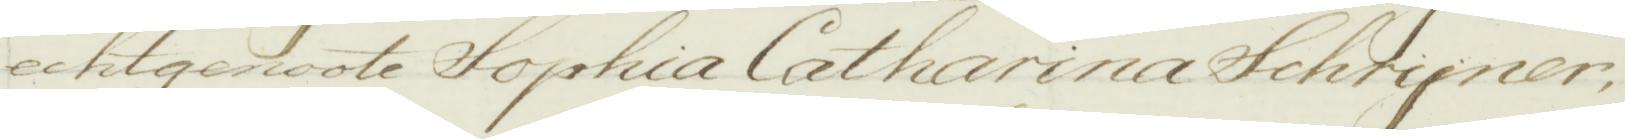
echtgenoote Sophia Catharina Schrijner,
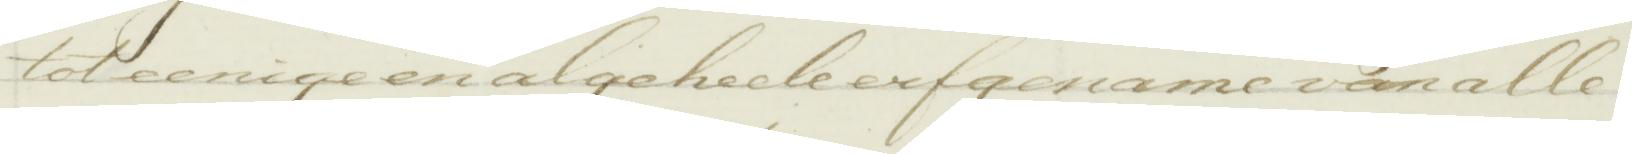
tol eenige en algeheele erfgename van alle
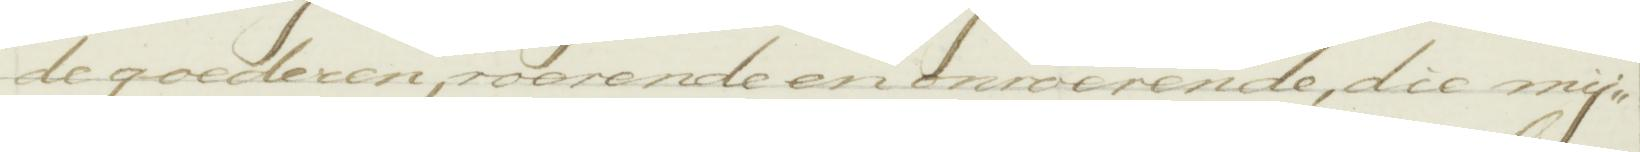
de goederen, roerende en onroerende, die mij„
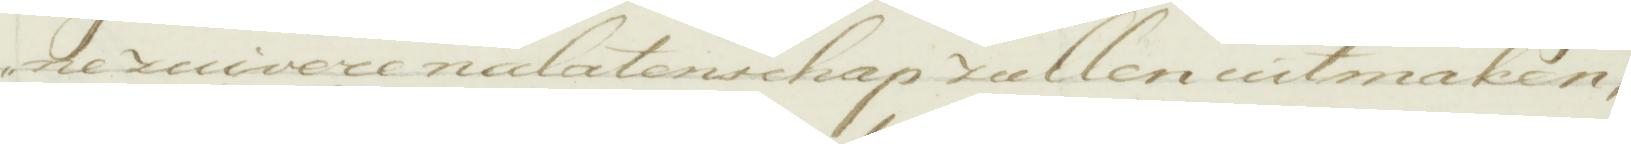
„ne zuivere nalatenschap zullen uitmaken,
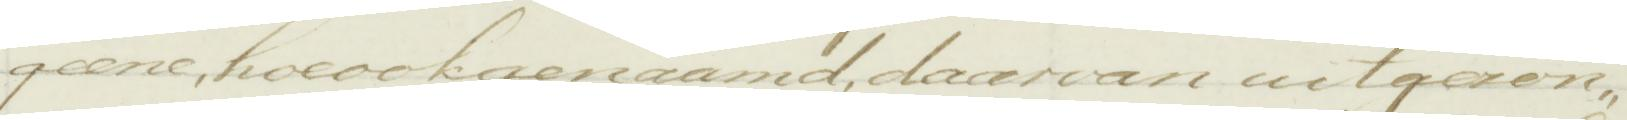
geene, hoeookgenaamd, daarvan uitgezon„
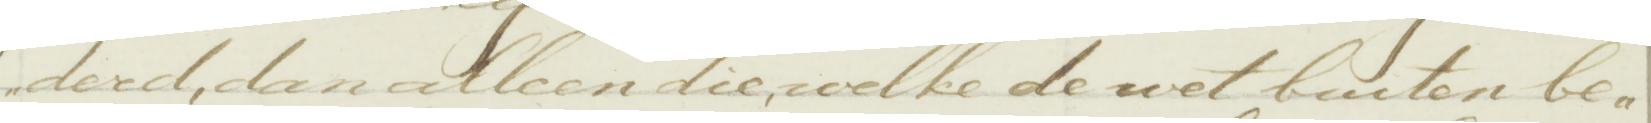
„derd, dan alleen die welke de wet buiten be„
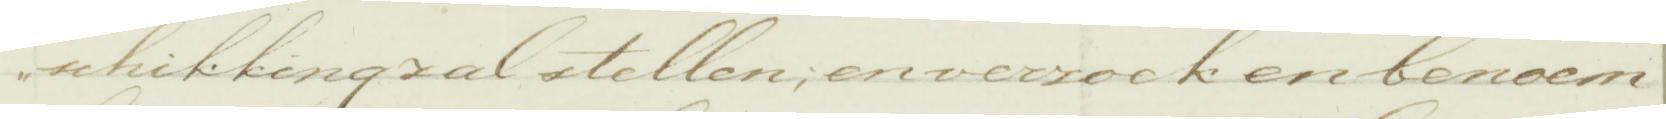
„schikking zal stellen; en verzoek en benoem
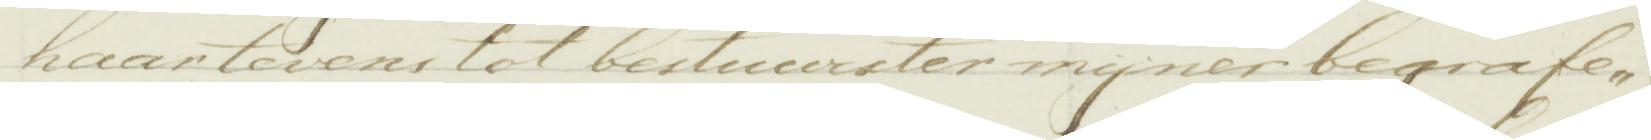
haar tevens tot bestuurster mijner begrafe
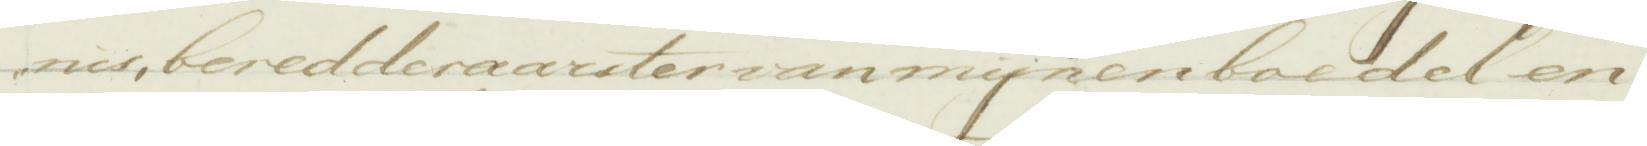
„nis, beredderaarster van mijnen boedel en
